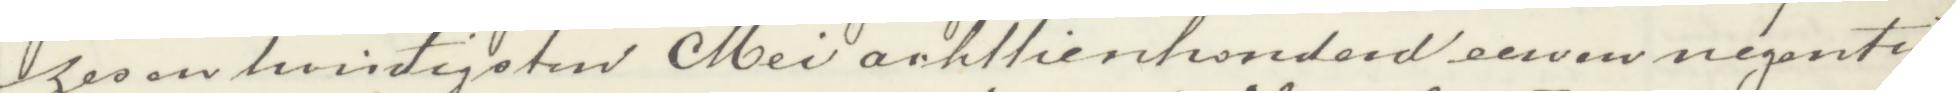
zes en twingsten Mei achttienhonderd een en negentig
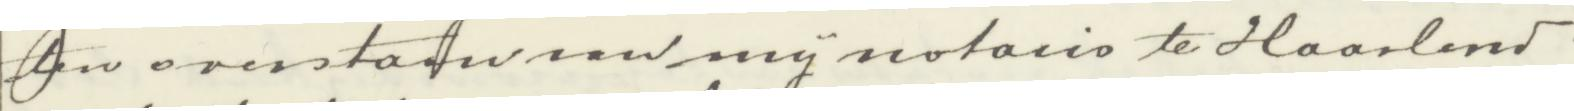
ten overstaan van mij notaris te Haarlem
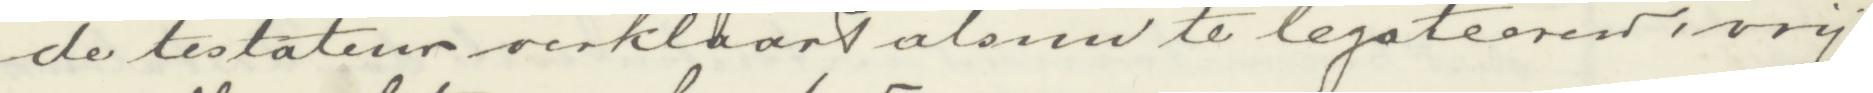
de testateur verklaart alsnu te legateeren, vrij
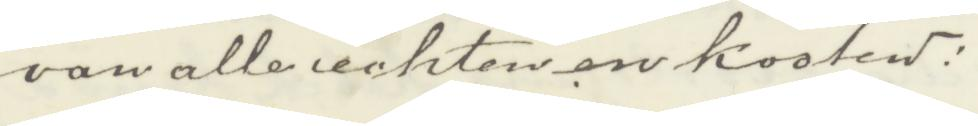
van alle rechten en kosten:
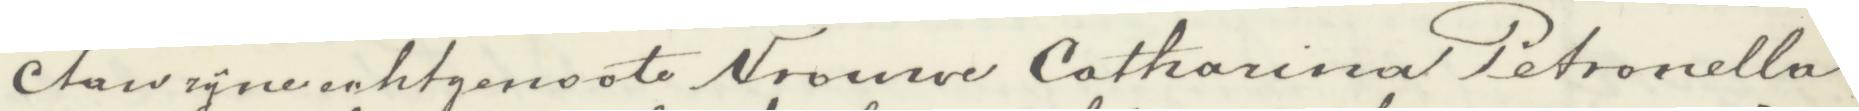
Aan zijne echtgenoote Vrouwe Catharina Petronella
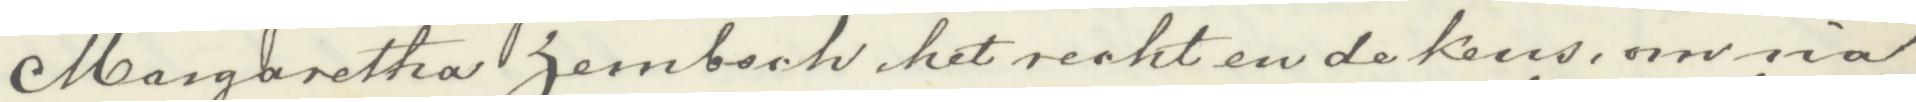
Margaretha Zembsch het recht en de keus, om nà
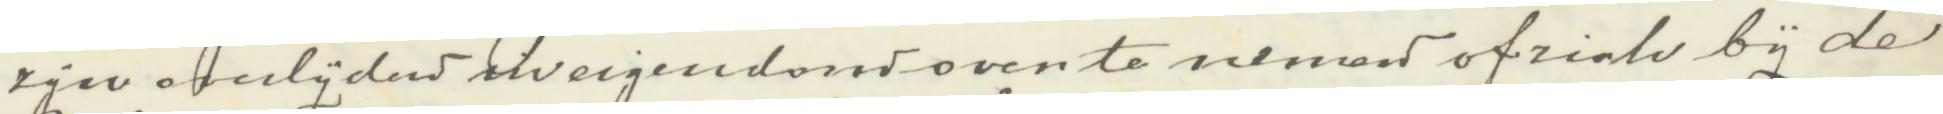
zijn overlijden in eigendom over te nemen of zich bij de
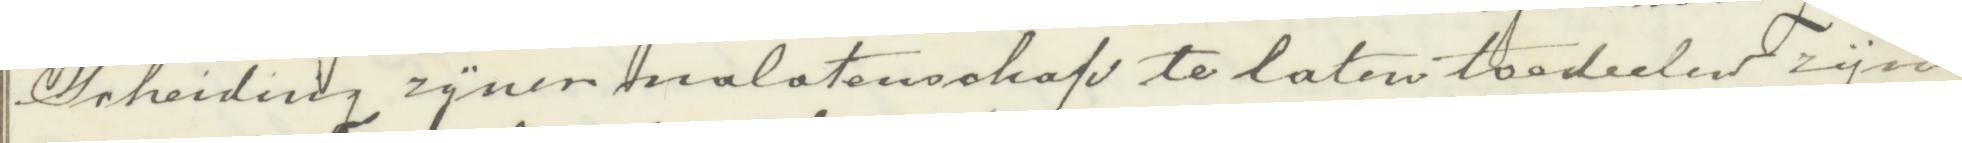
Scheiding zijner nalatenschap te laten toedeelen zijn
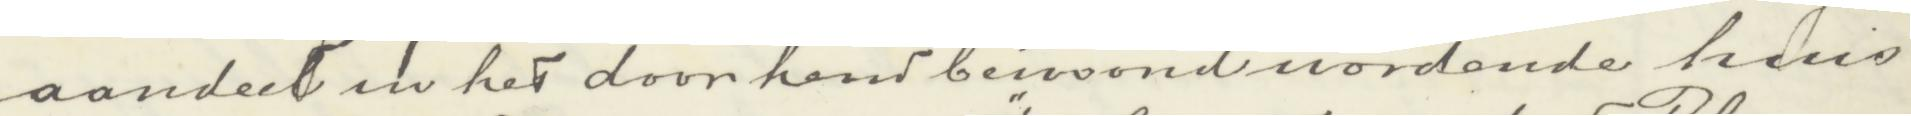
aandeel in het door hem bewoond wordende huis
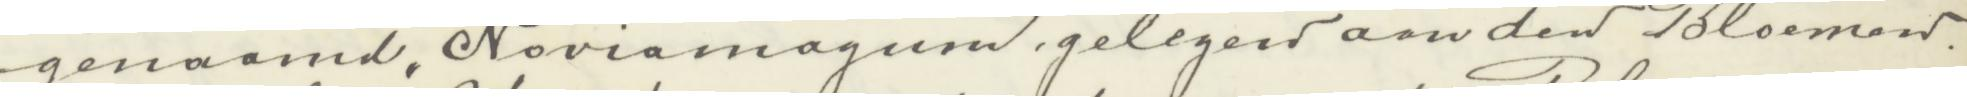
genaamd „Noviamagum", gelegen aan den Bloemen.
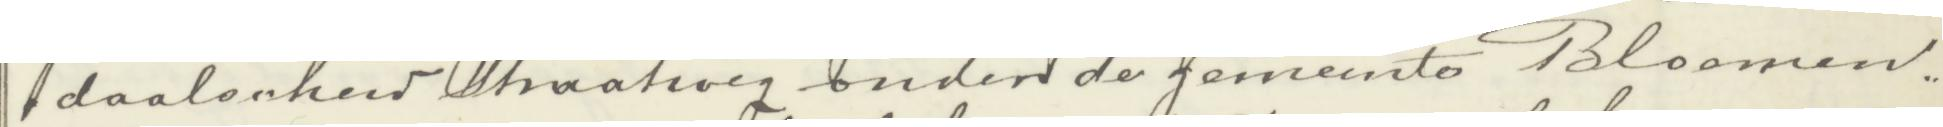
daalschen Straatweg onder de gemeente Bloemen„
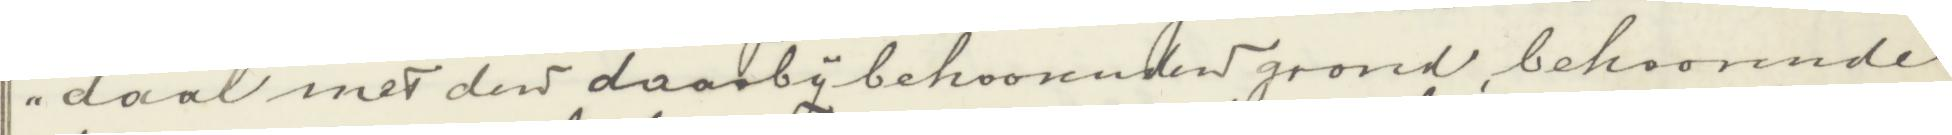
„daal met den daarbij behoorenden grond, behoorende
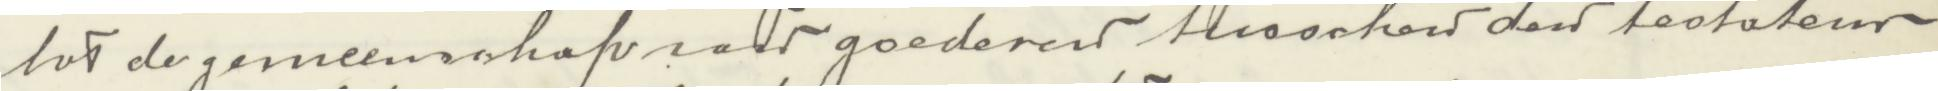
tot de gemeenschap van goederen tuschen den testateur
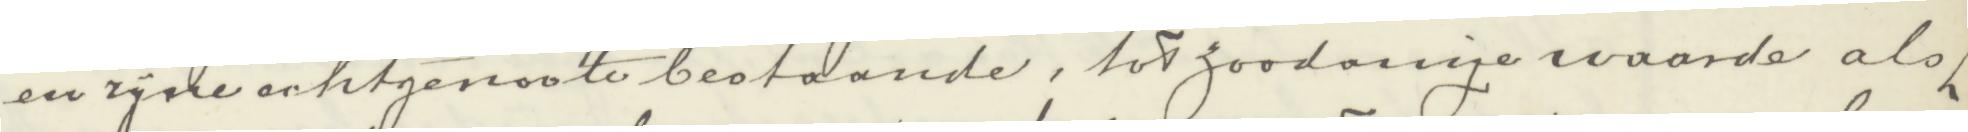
en zijne echtgenoote bestaande, tot zoodanige waarde als¶
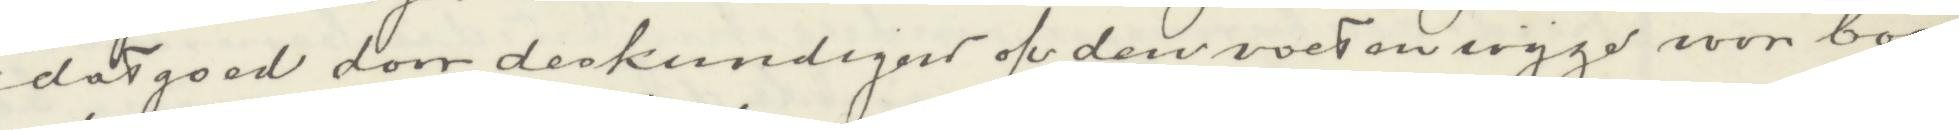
dat goed door deskundigen op den voet en wijze voor boe
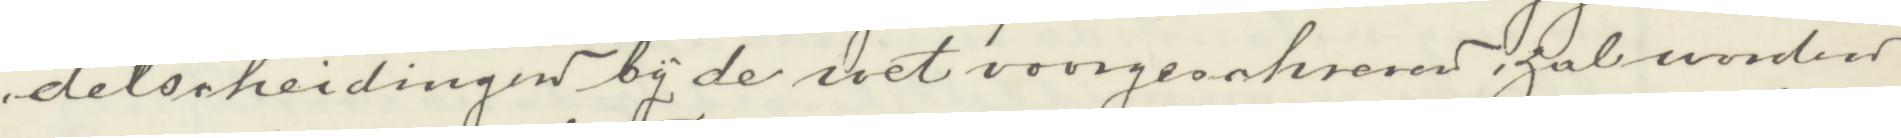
„delscheidingen bij de wet voorgeschreven, zal worden
